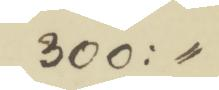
300: „
